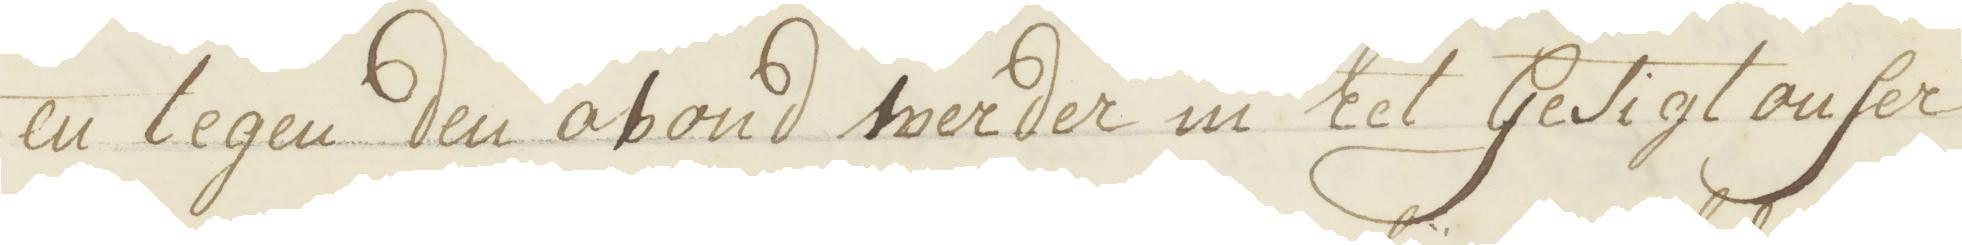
en tegen den avond werder in het gesigt onser
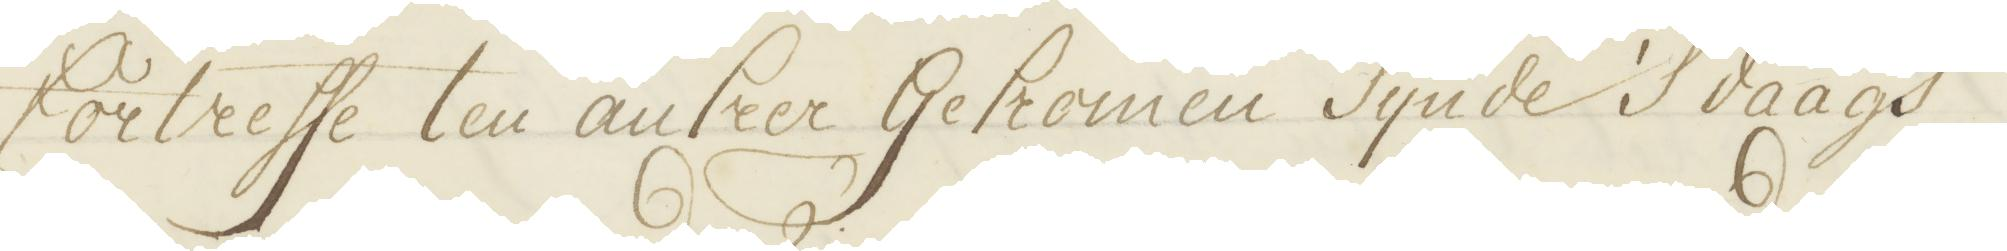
fortresse ten anker gekomen sijnde 's daags
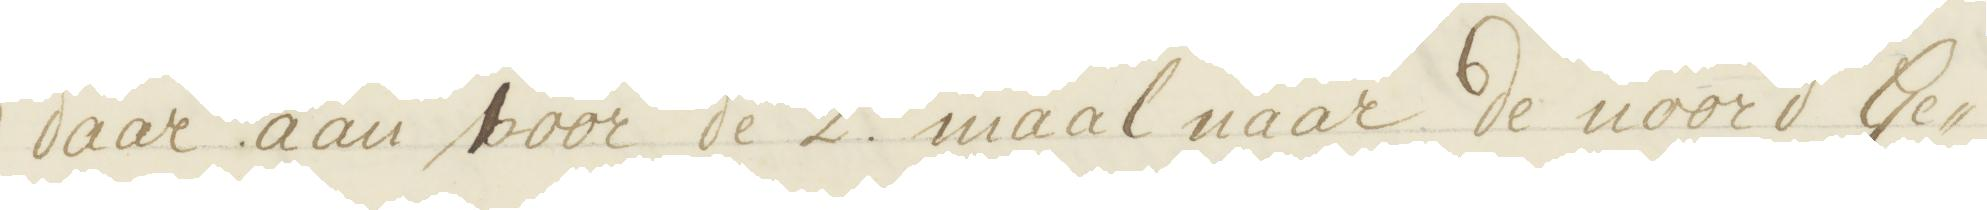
daar aan voor de 2:' maal naar de noord Ge„
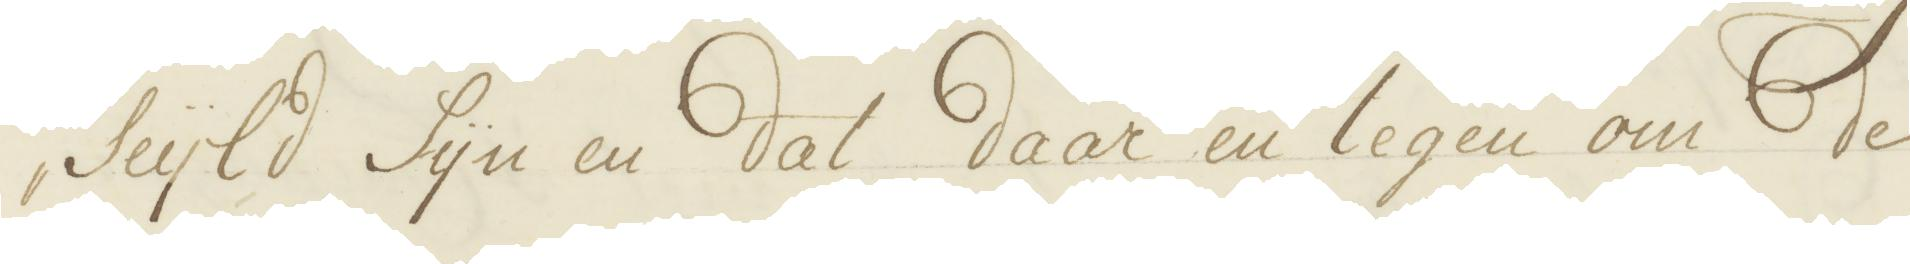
„seijld sijn en dat daar en tegen om de
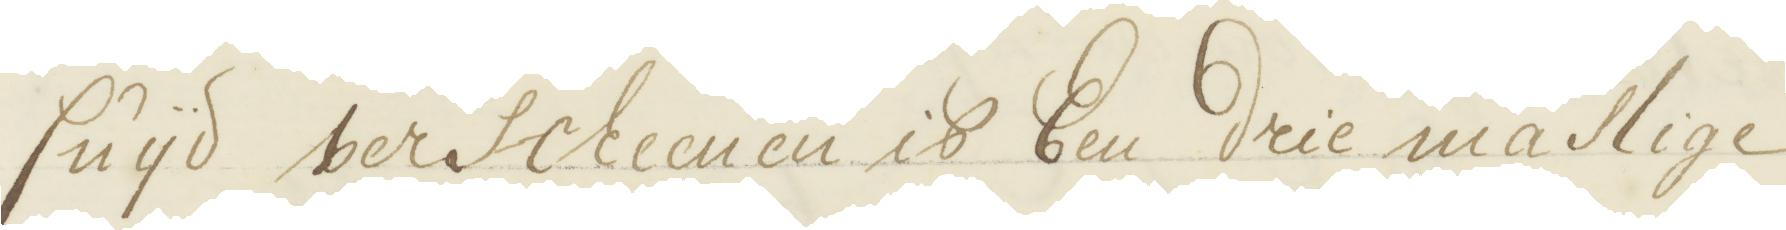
suijd verscheenen is Een drie mastige
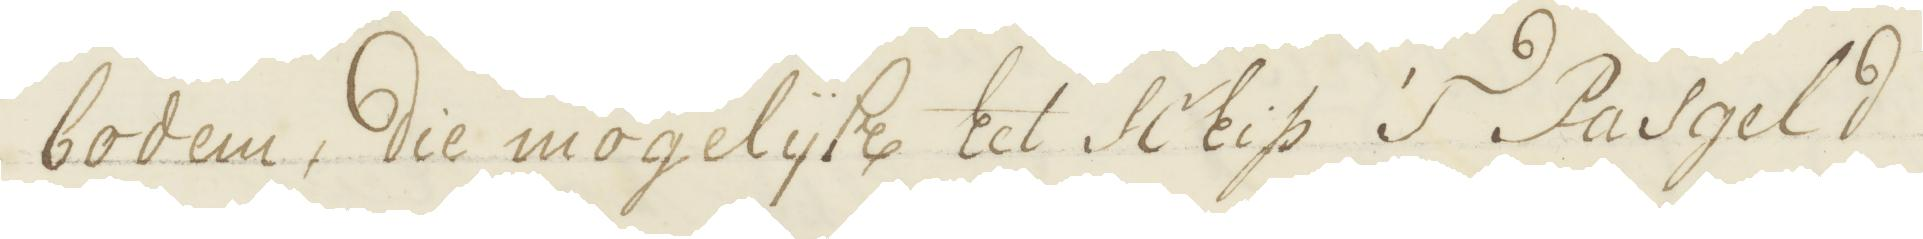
bodem, die mogelijk het schip 'T Pasgeld
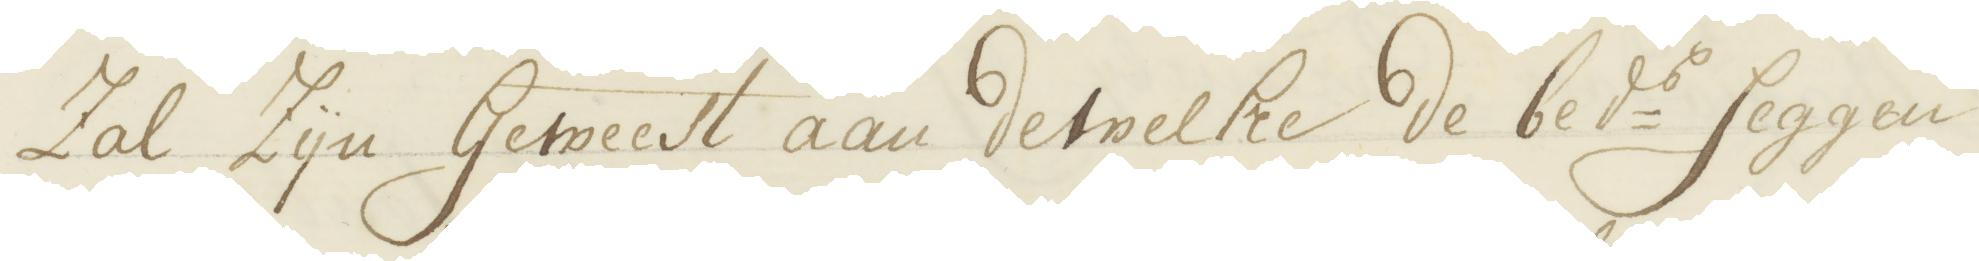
zal zijn geweest aan dewelke de bed=s seggen
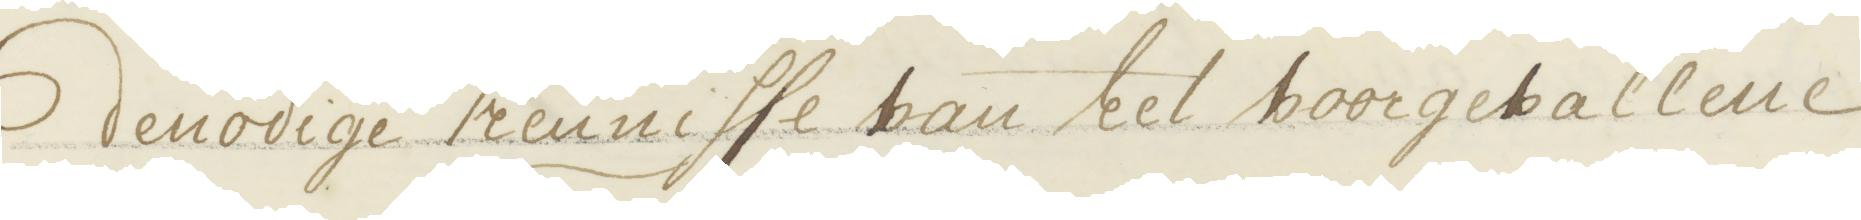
denodige kennisse van het voorgevallene
